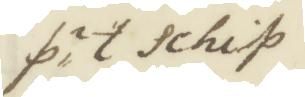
p„r ’t schip
